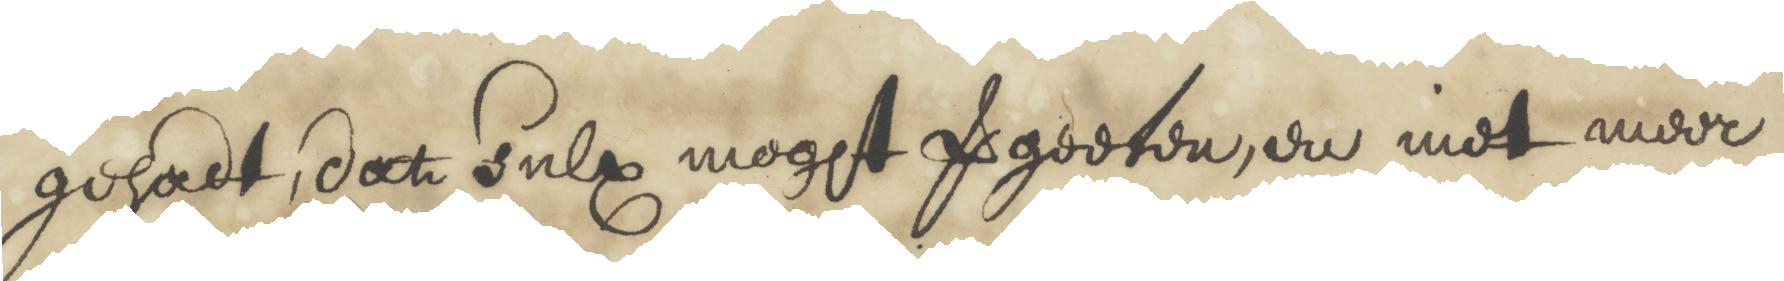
gehadt, dat sulx moght vergeeten, en niet meer
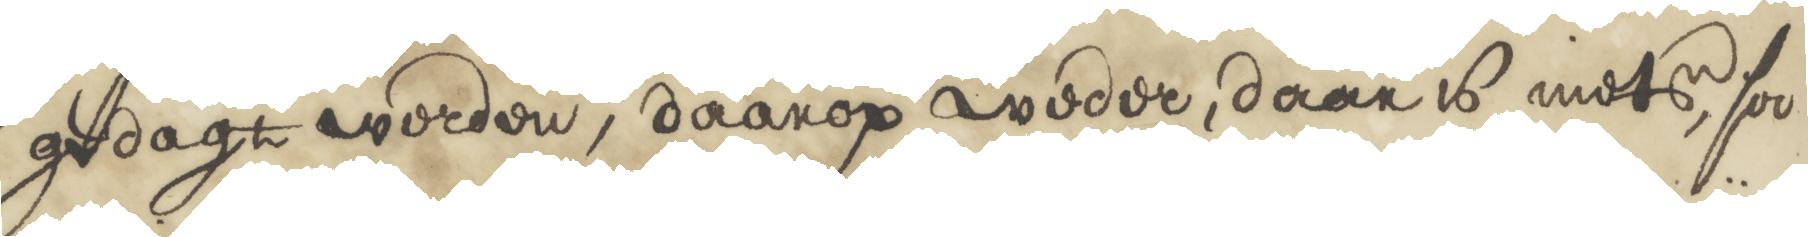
gedagt werden, daarop weder, daar is niets, soo
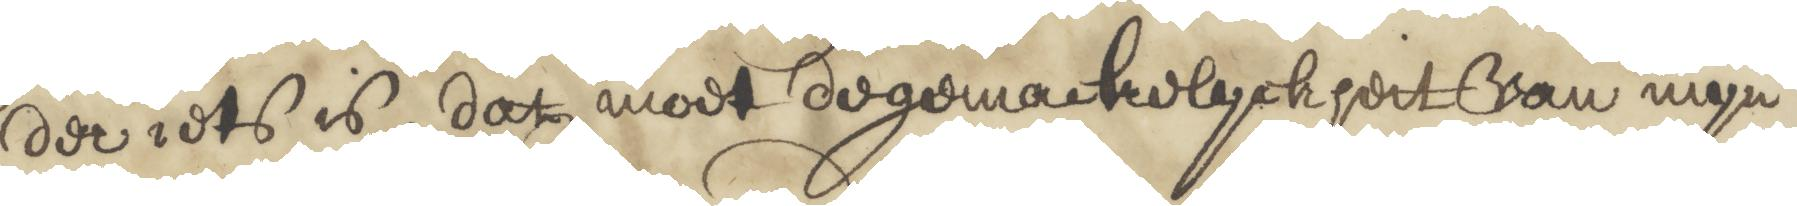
der iets is dat moet de gemackelyckheit van mijn
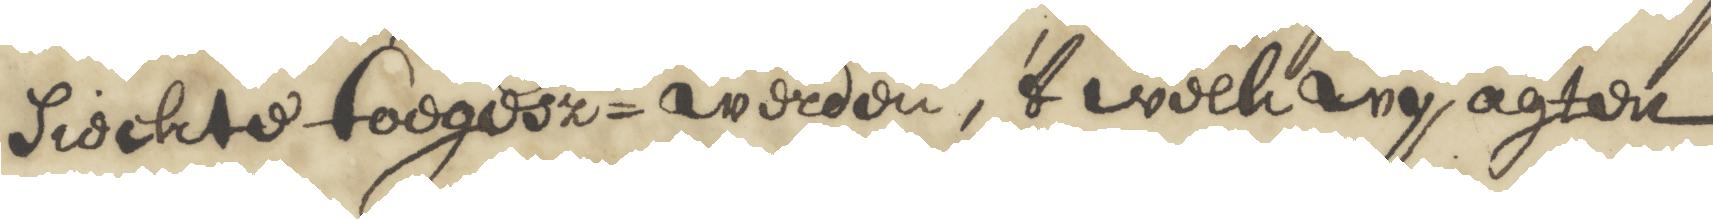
sieckte toegesz=e werden, ’t welk wij, agter
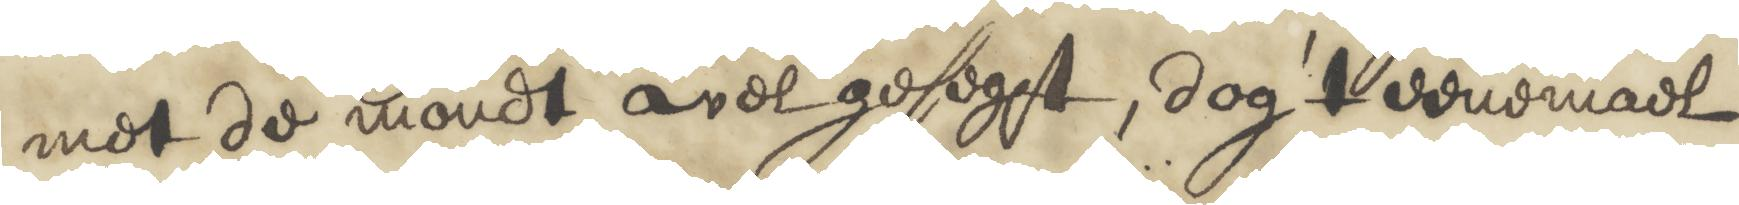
met de mondt wel geseght, dog 't eenemael
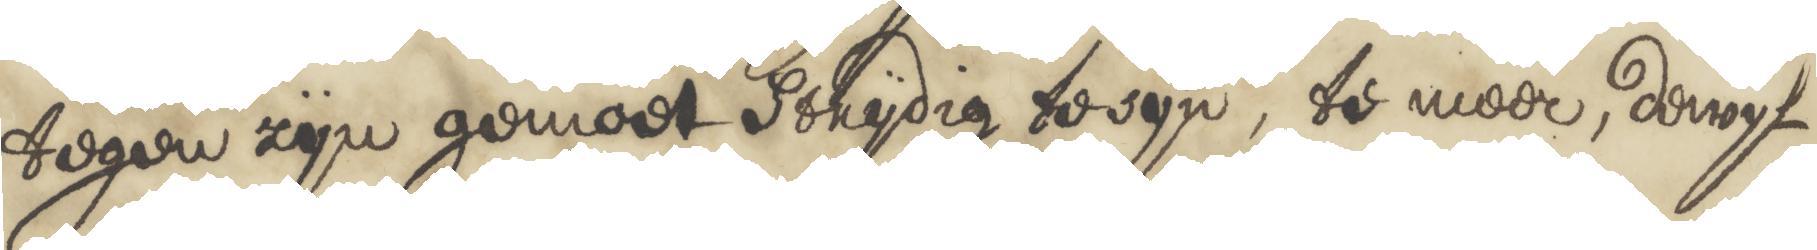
tegen zijn gemoet strijdig te sijn, te meer, dewijl
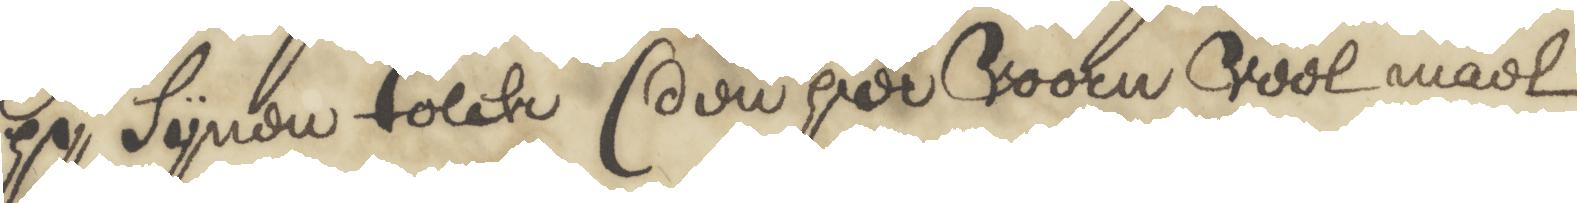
hij Sijnen tolck (den hier voorn veel mael
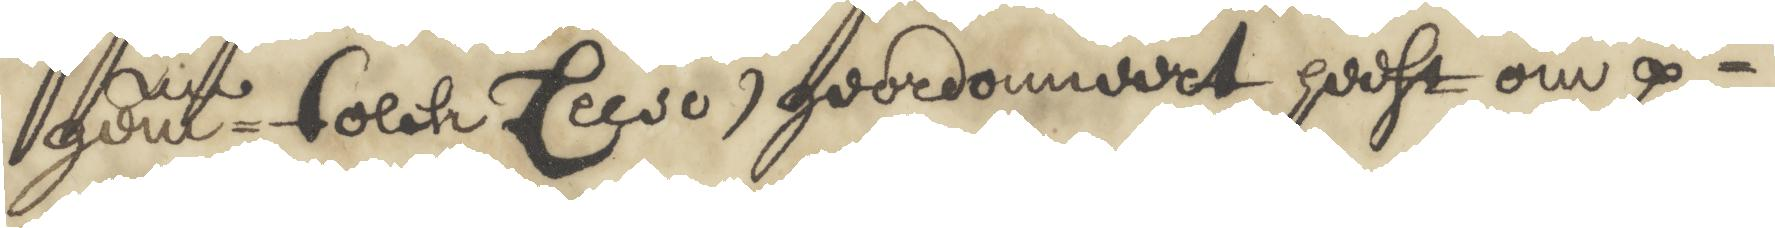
gem=e tolck Cecso) geordonneert heeft om p=r
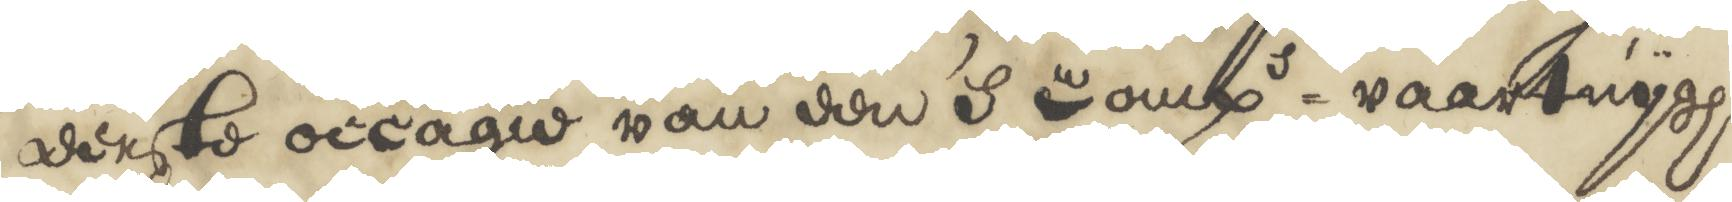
eerste occagie van een ’s Comp=s vaartuijgh
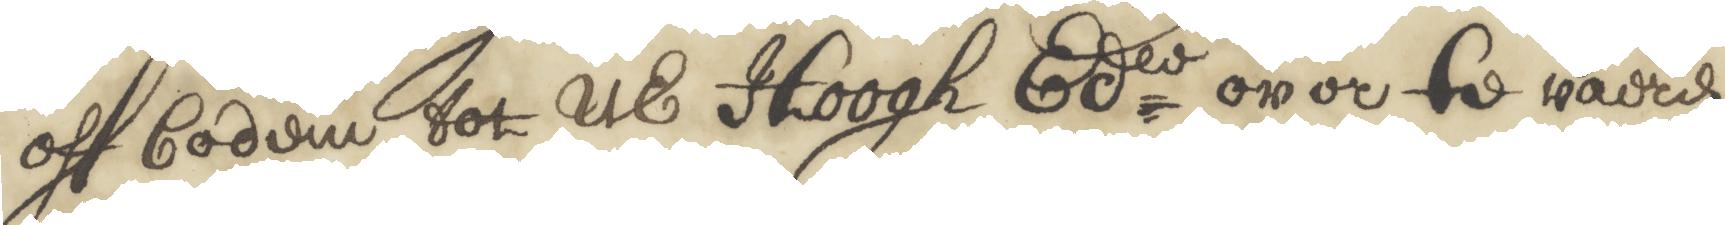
oft bodem tot UE Hoogh Ed=le over te vaeren
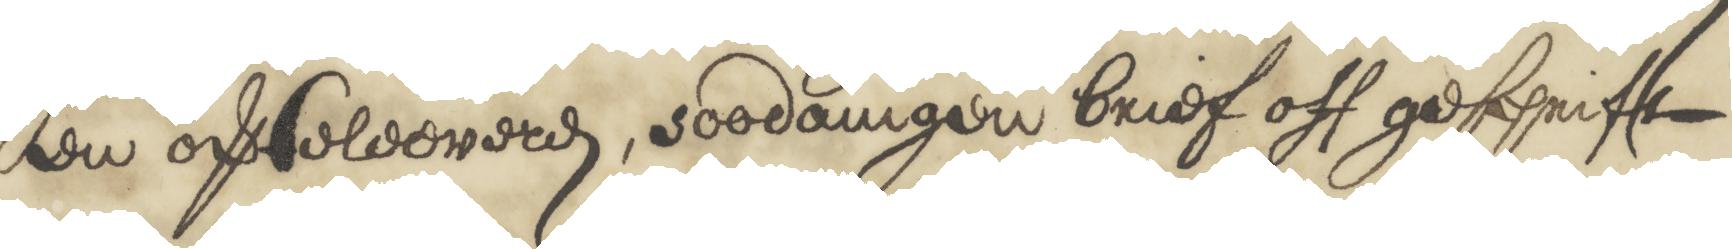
en over teleeveren, soodanigen brief off geschrift
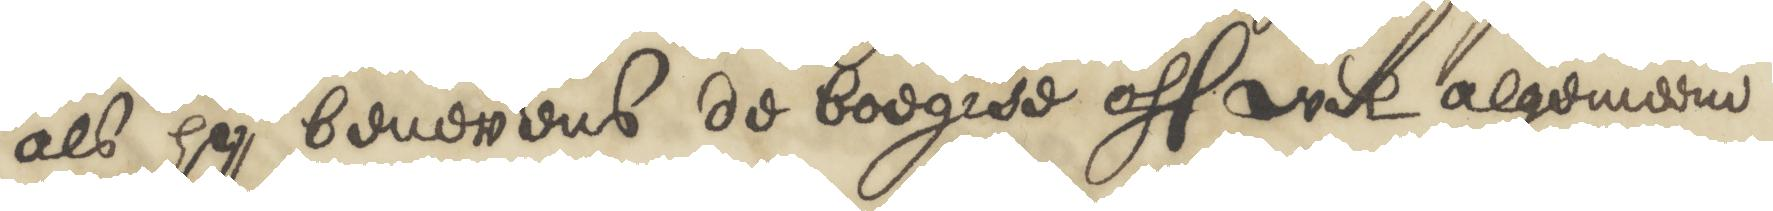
als hij benevens de boegise off wel algemeene
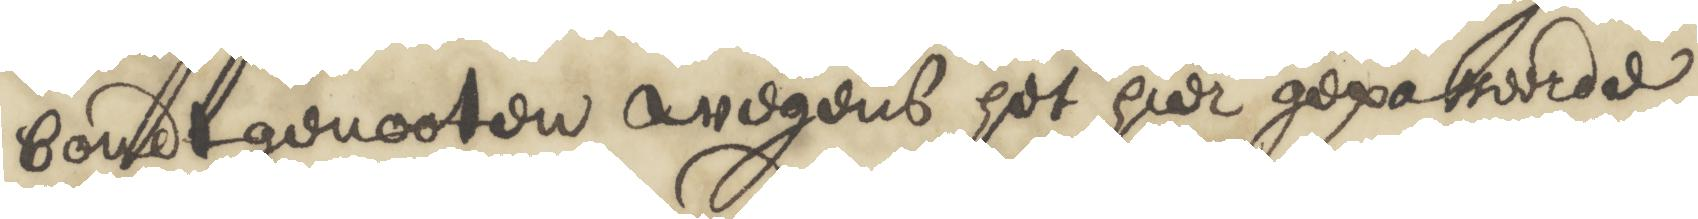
bondtgenooten wegens het hier gepasseerde
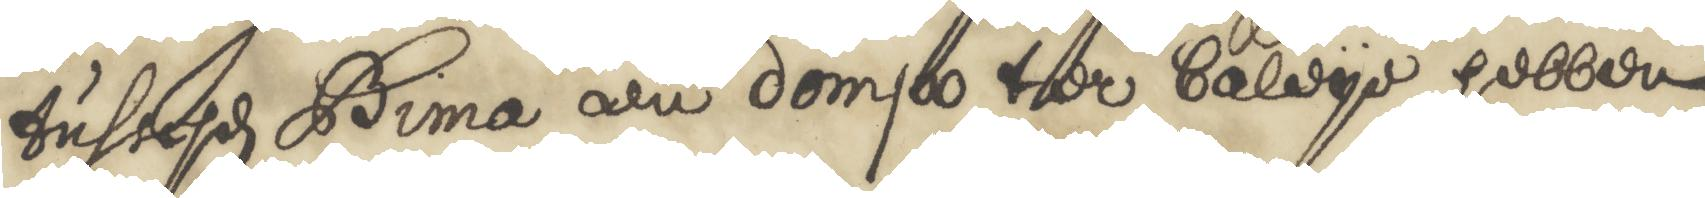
tusschen Bima en dompo ter baleije hebben
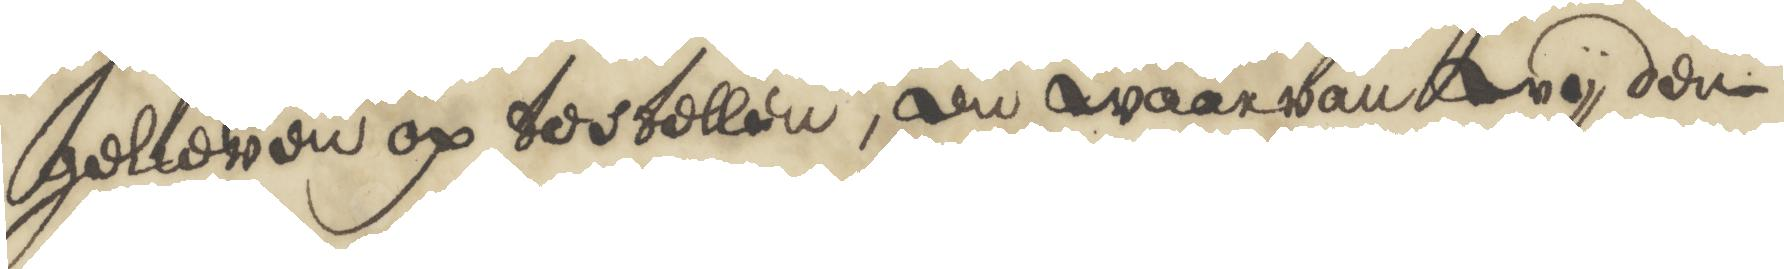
gelieven op te stellen, en waarvan wij den
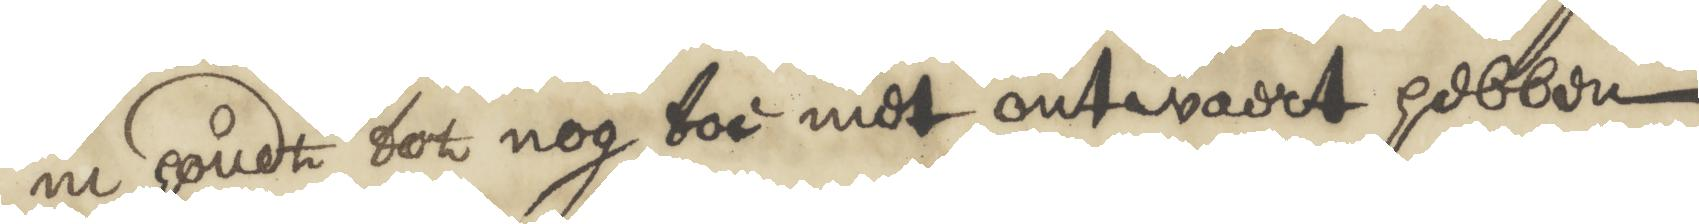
in houdt tot nog toe niet ontwaert hebben
